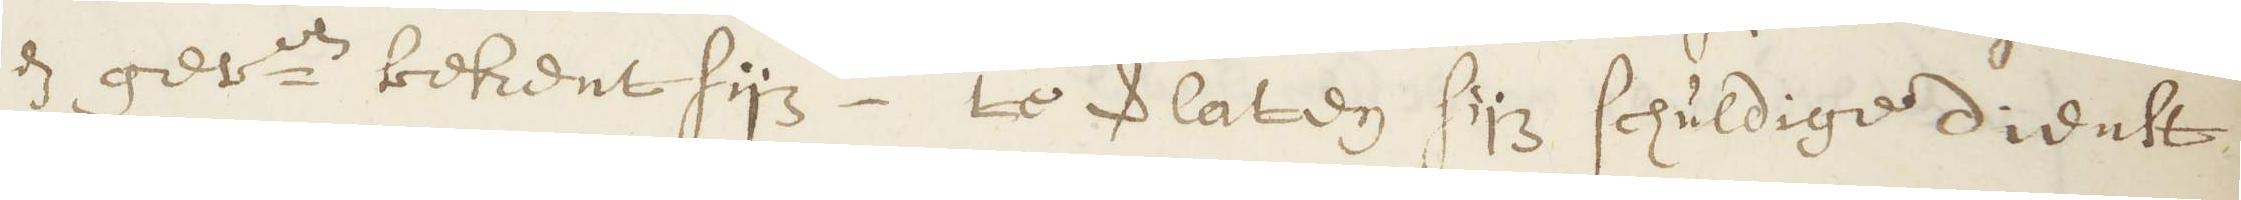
Den gev=en bekent sijn — te verlaten sijn schuldige dienst
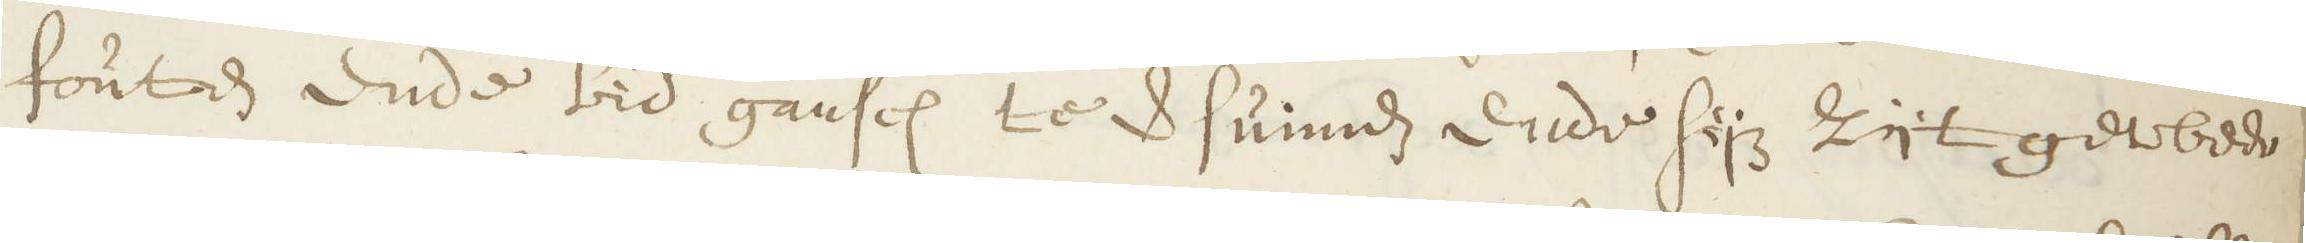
fouten ende bid gansch te versuimen ende sijn zijtgeweer
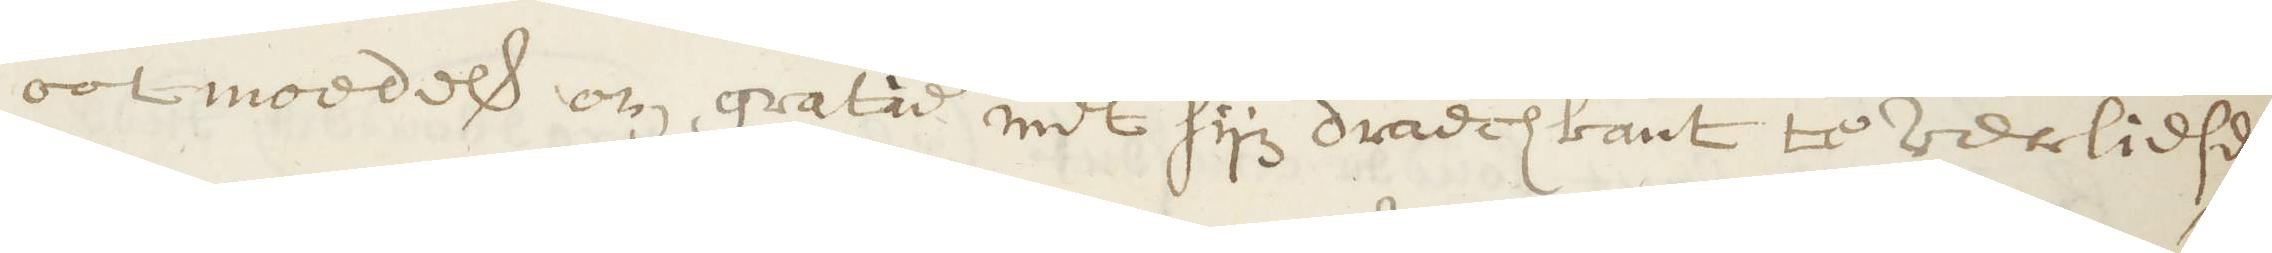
ootmoedelijk om gratie met sijn draechbant te verliesen
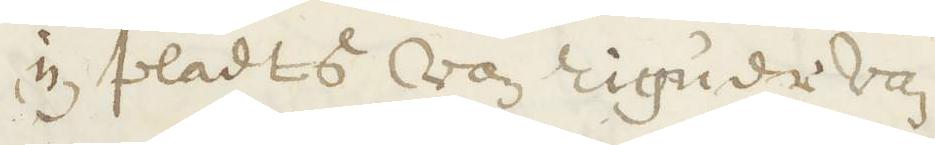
in plaets van riguer van
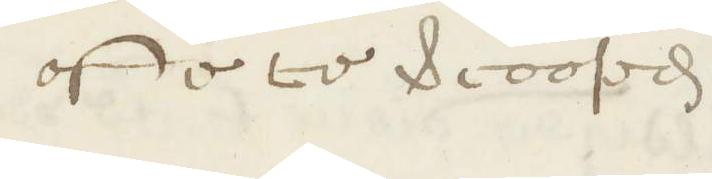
ofte te vercoopen
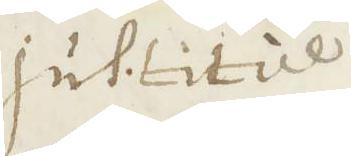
justitie
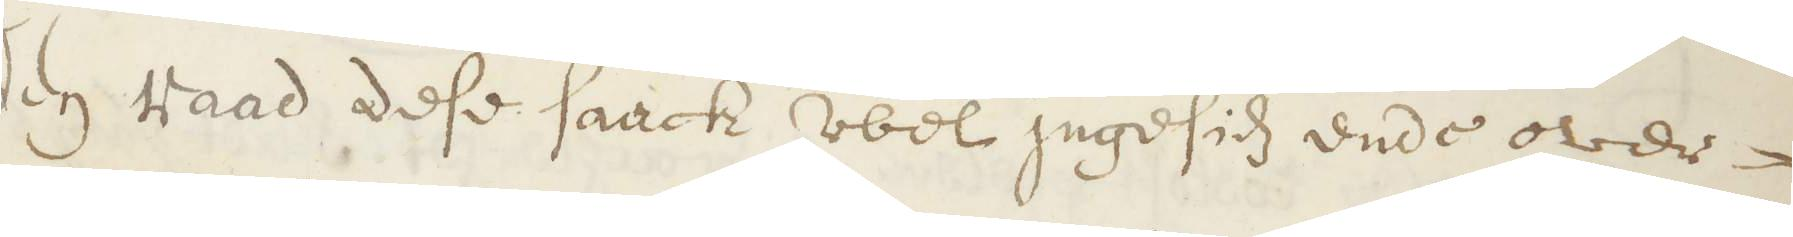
Den raad dese saack wel jngesien ende over—
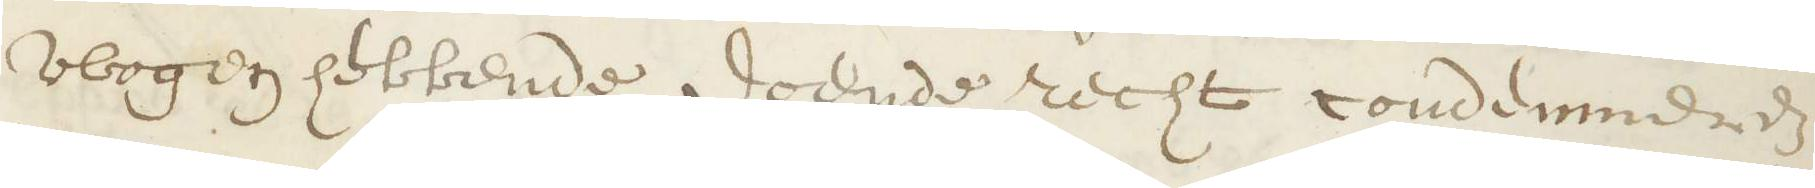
wogen hebbende doende recht condemneren
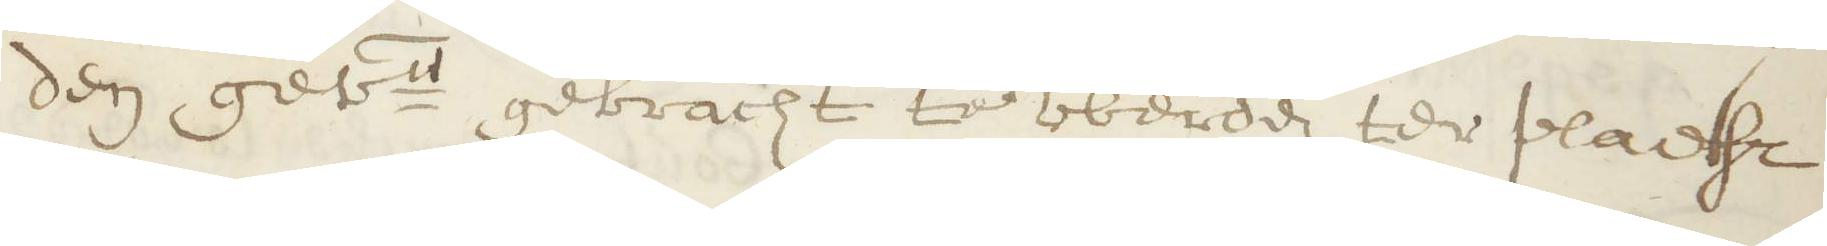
den gev=n gebracht te werden ter plaetse
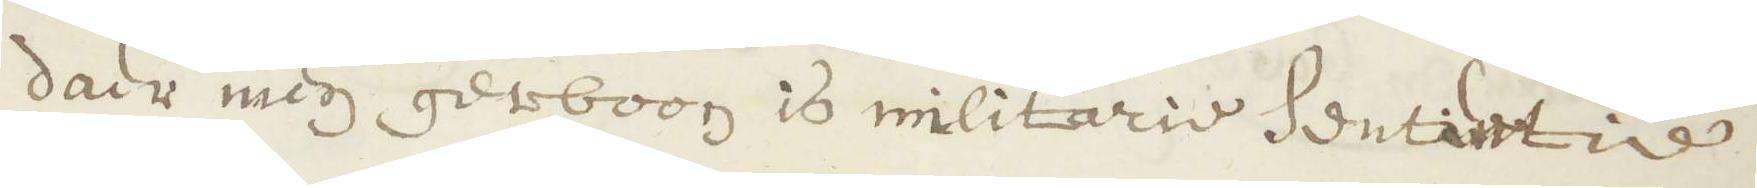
daer men gewoon is militarie sententie
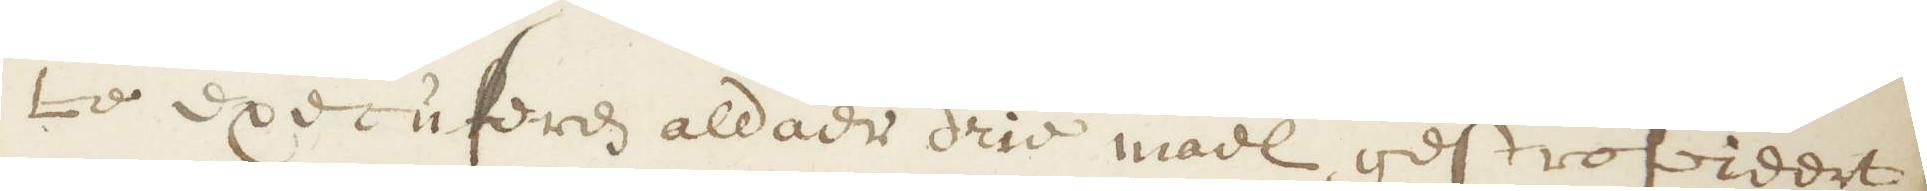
te executeren aldaer drie mael gestropieert
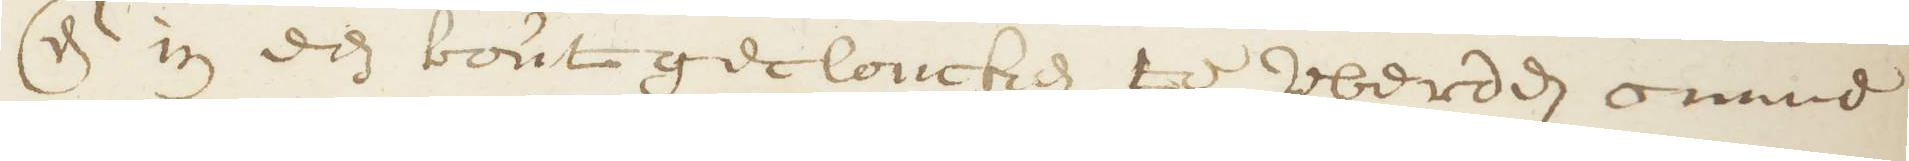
ende in een bout gecloncken te werden omme
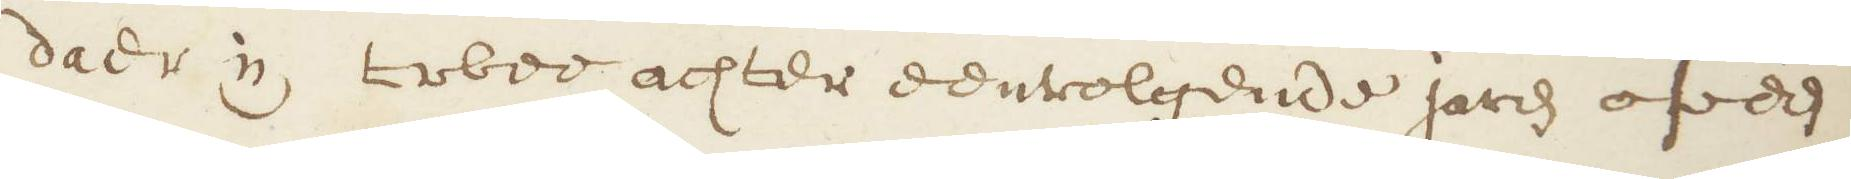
daer in, twee achter eenvolgende jaren op een
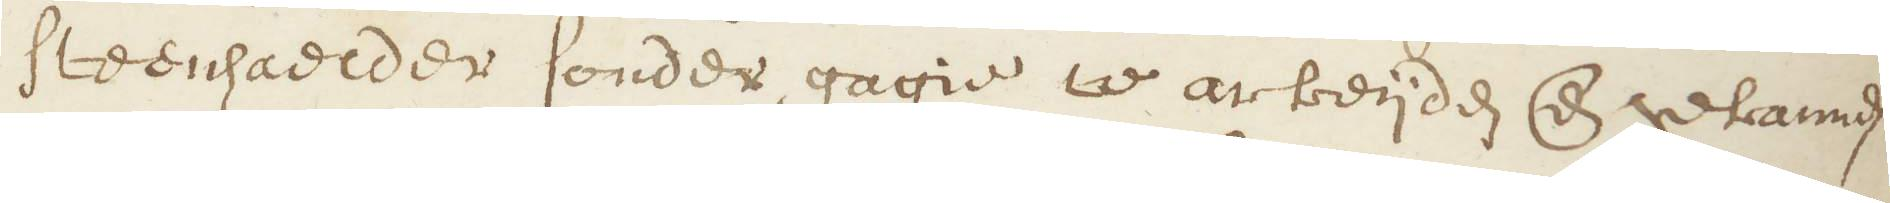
steengaerder sonder gagie te arbeijden ende gebannen
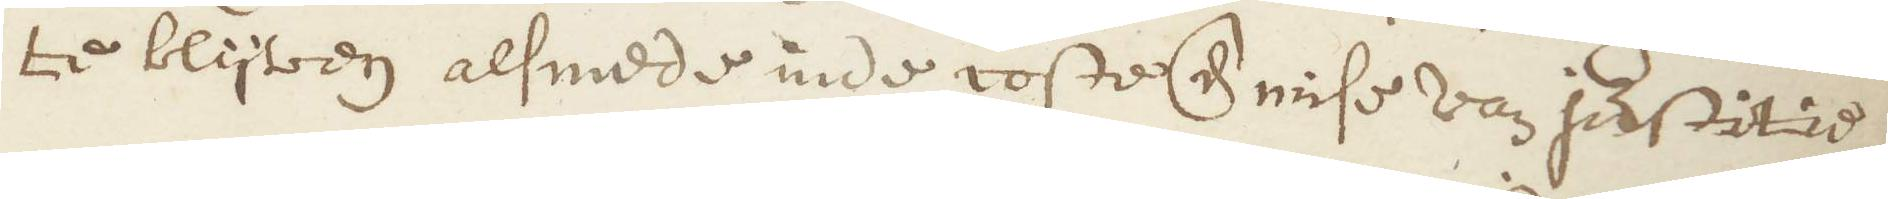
te blijven alsmede inde coste ende mise van justitie
